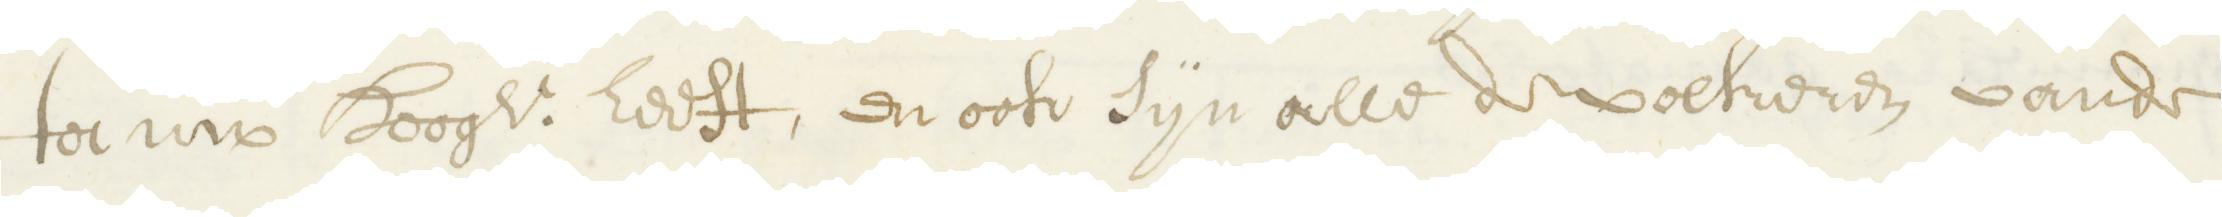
tot uw Hoogh.t heeft, en ook sijn alle de volkeren vande
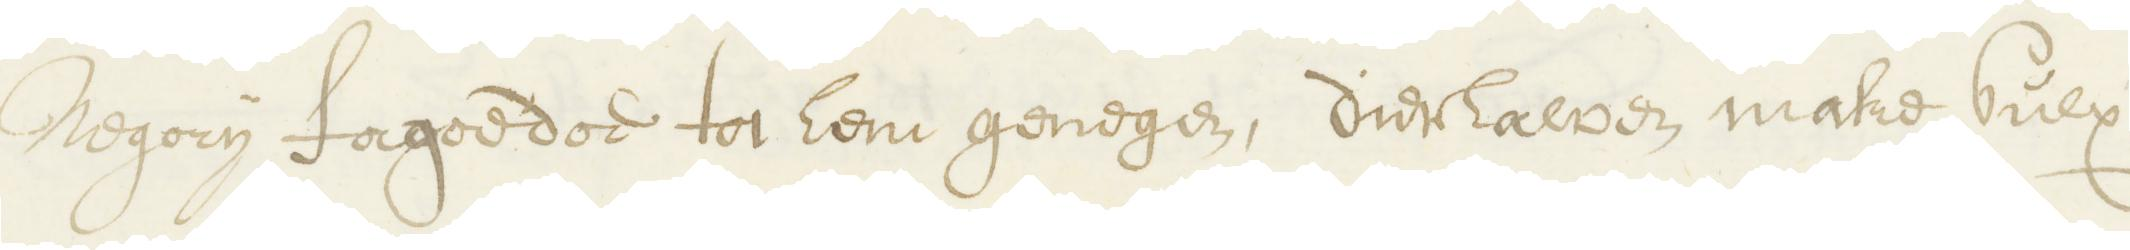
negorij fagoedoe tot hem genegen, dierhalven make sulx
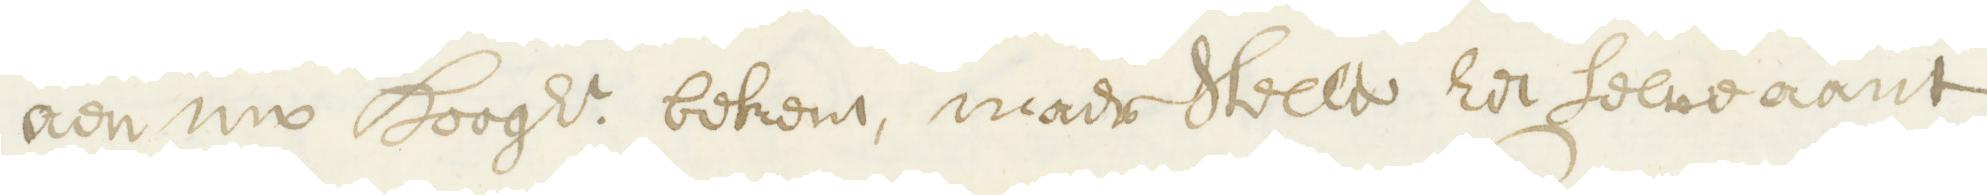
aen uw Hoogh.t bekent, maer stelde het selve aan't
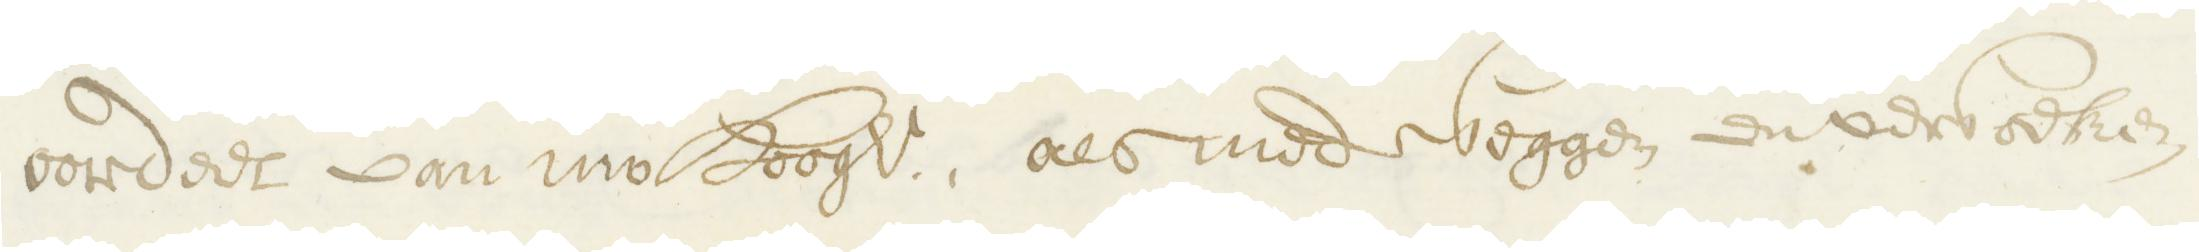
oordeel van uw Hoogh.t, als mede seggen en versoeken
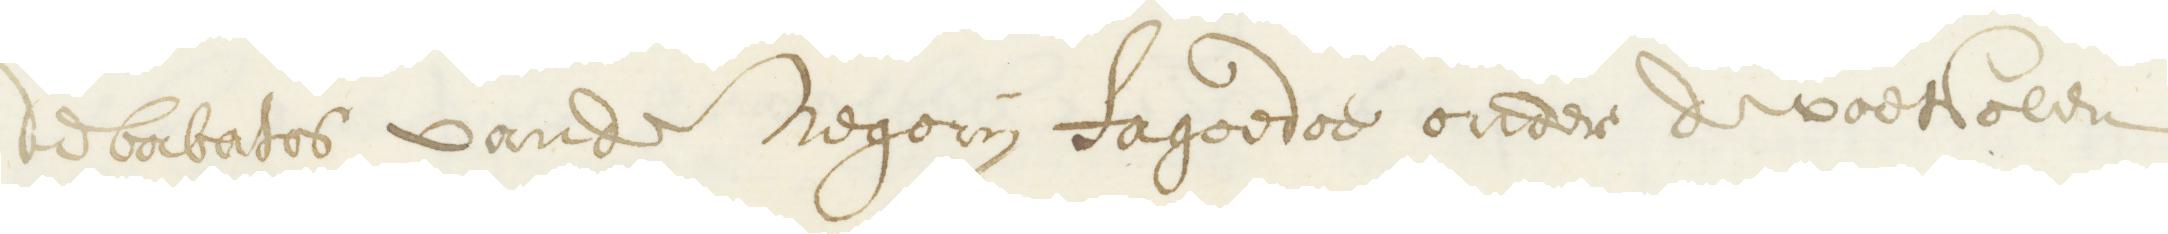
de babatos vande negorij fagoedoe onder de voetsolen
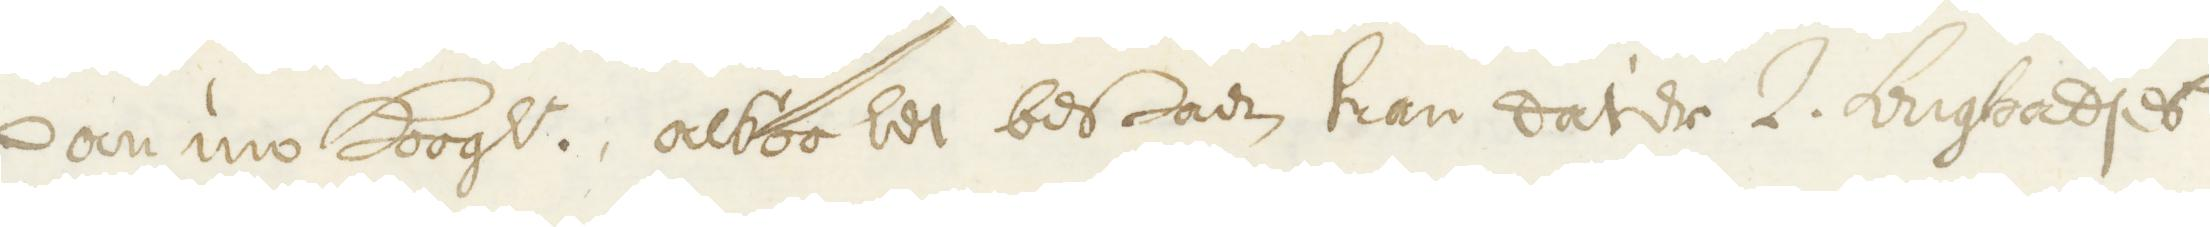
van uw Hoogh.t, alsoo het bestaen kan dat'er 2. senghadjes
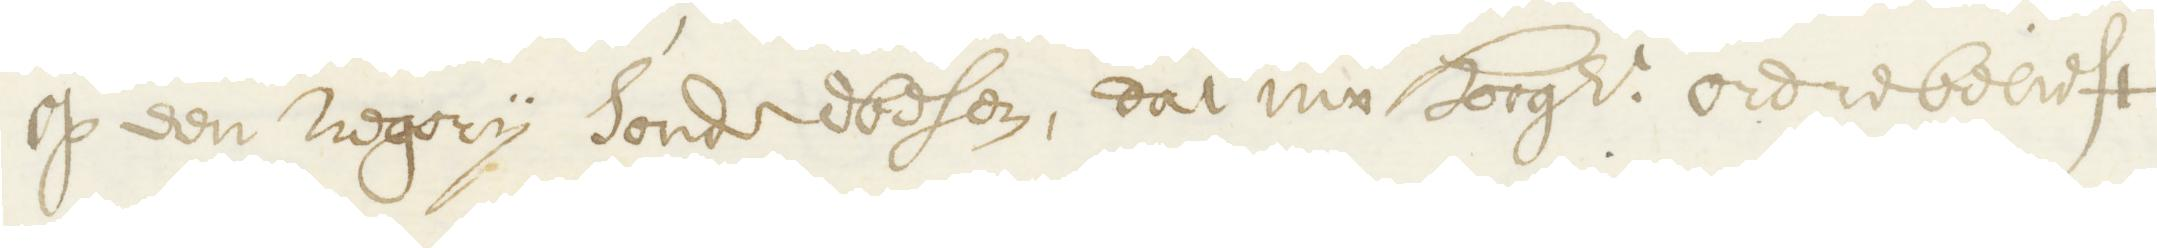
op een negorij soude wesen, dat uw Hoogh:t ordre belieft
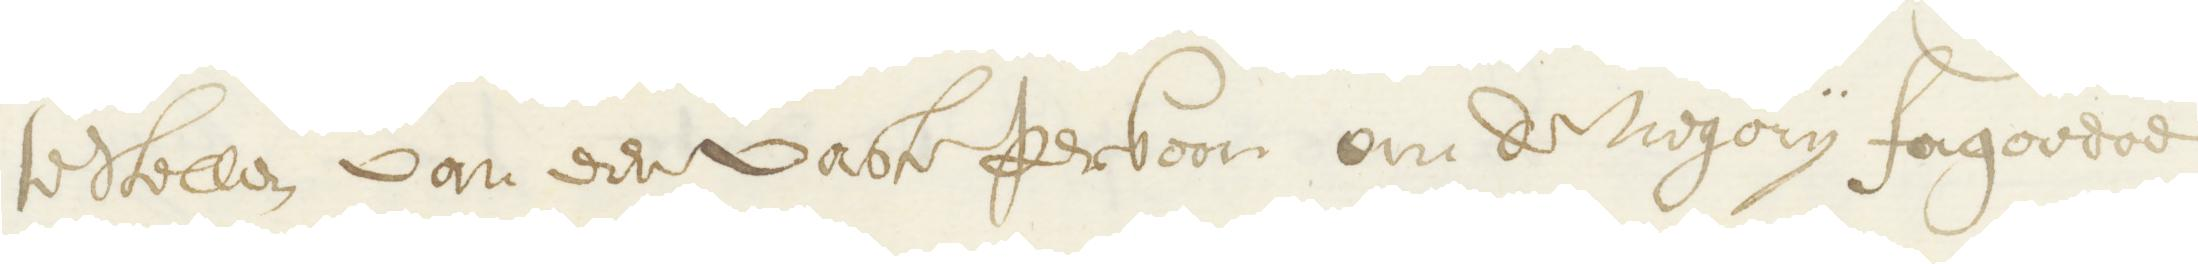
te stellen van een vaste persoon om de negorij fagoedoe
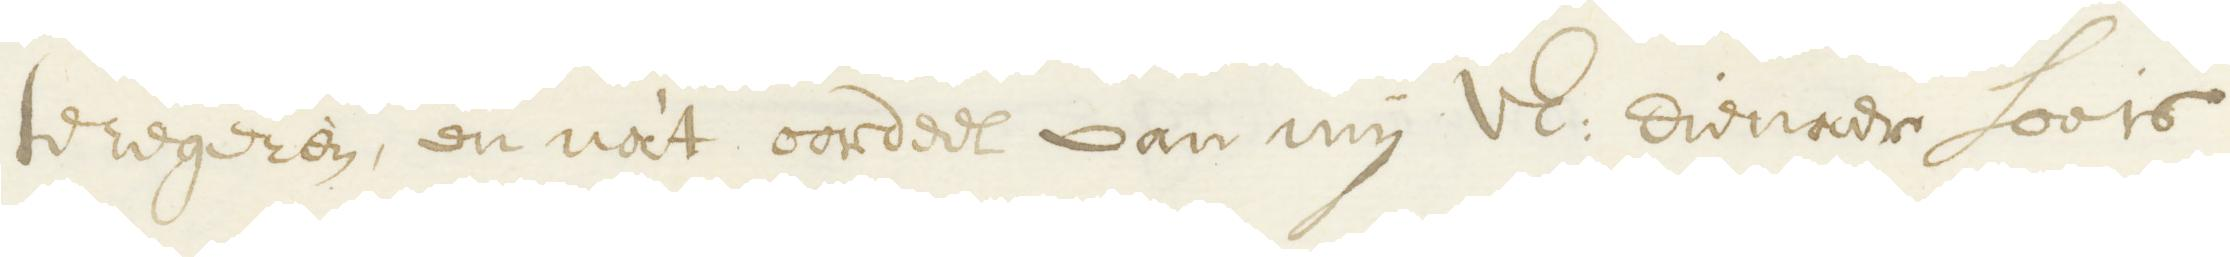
te regeren, en noit oordeel van mij VE: dienaer soo is
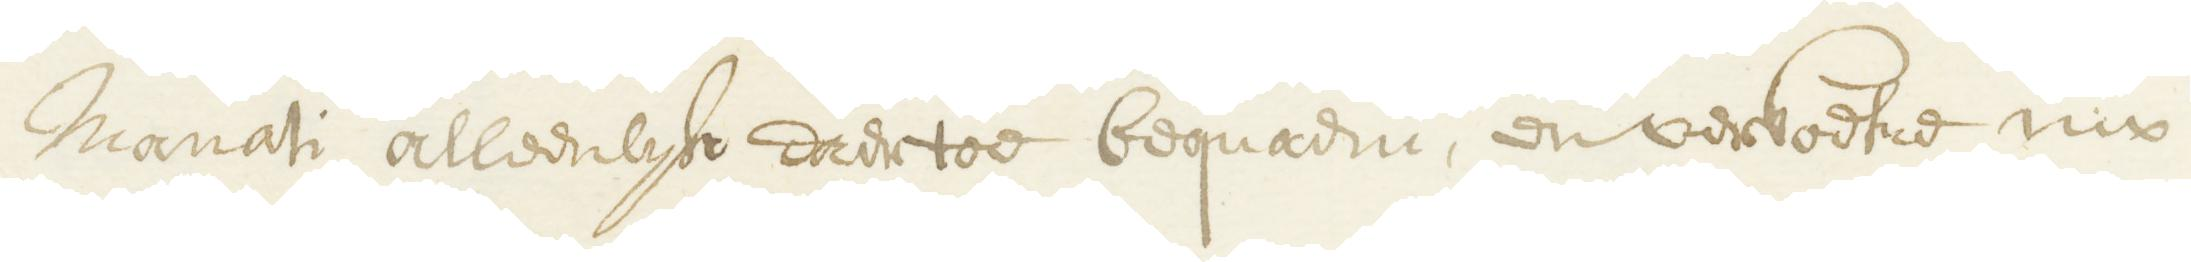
Manati alleenlijk daertoe bequaem, en versoeke uw
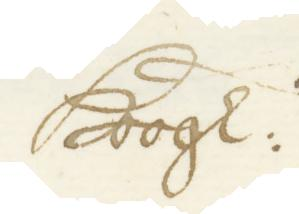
Hoogh:t
